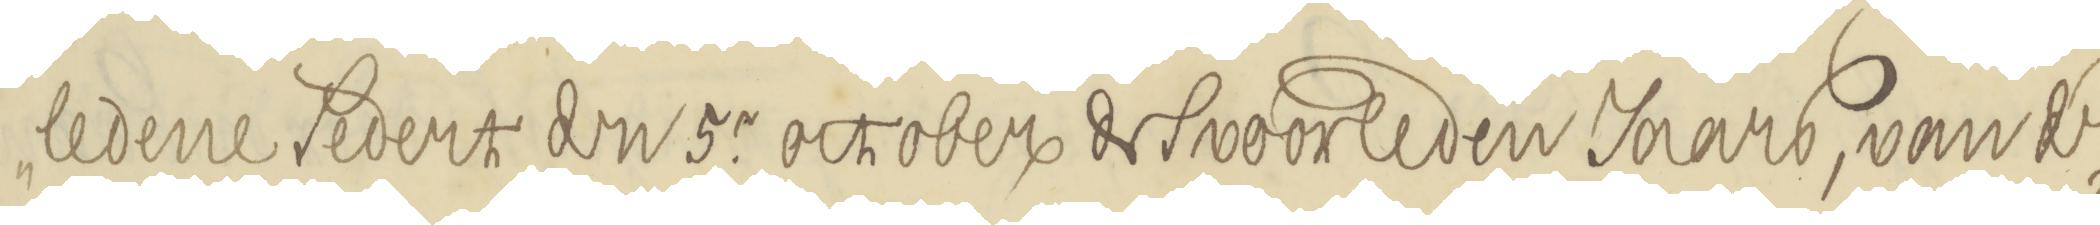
„ledene sedert den 5.' october des voorleden Iaars, van de
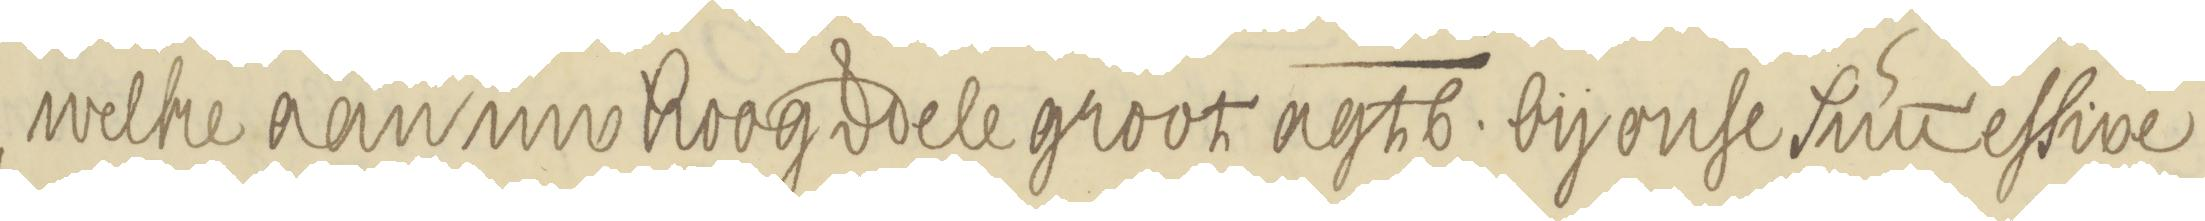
welke aan uw hoog Edele groot agtb: bij onse successive
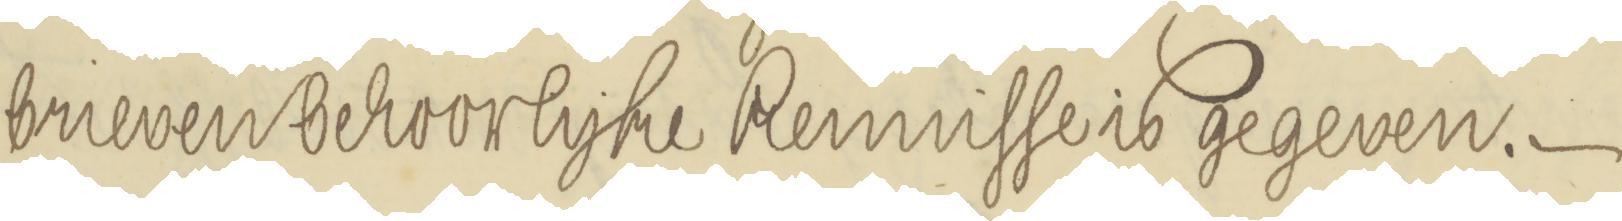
brieven behoorlijke kennisse is gegeven. —
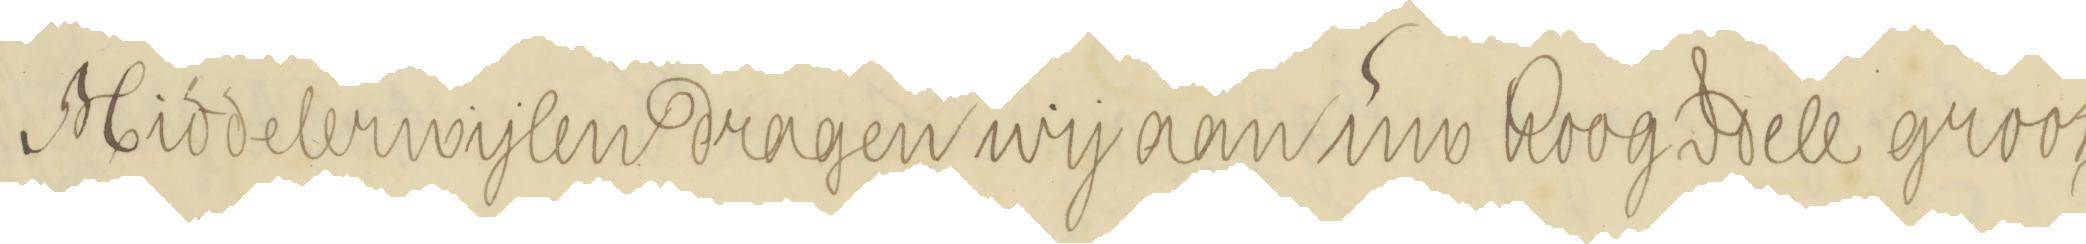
Middelerwijlen dragen wij aan uw hoog Edele groo
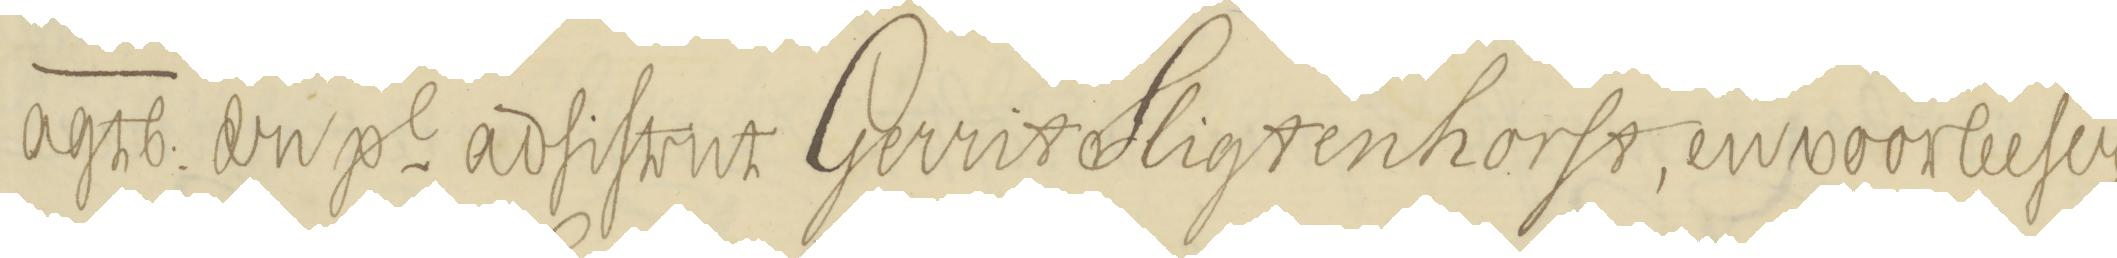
agtb: den p-l adsistent Gerrit Sligtenhorst, en voorleese
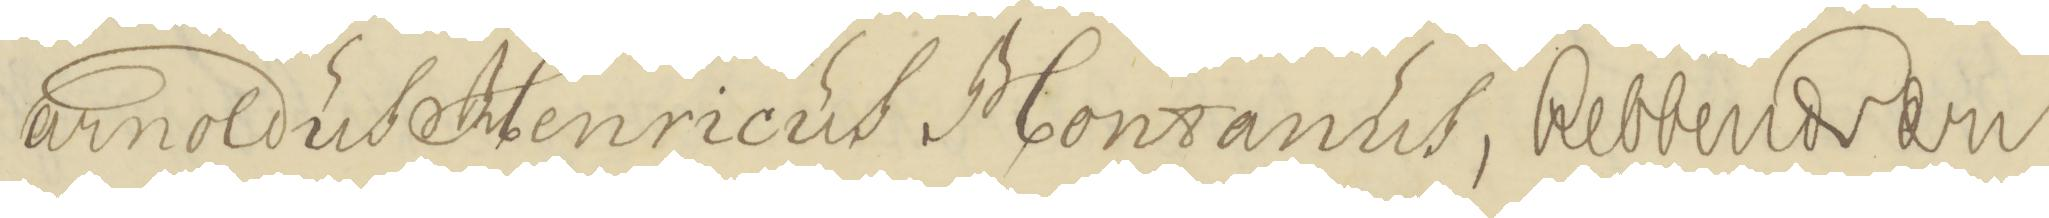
arnoldus Henricus Montanus, hebbende den
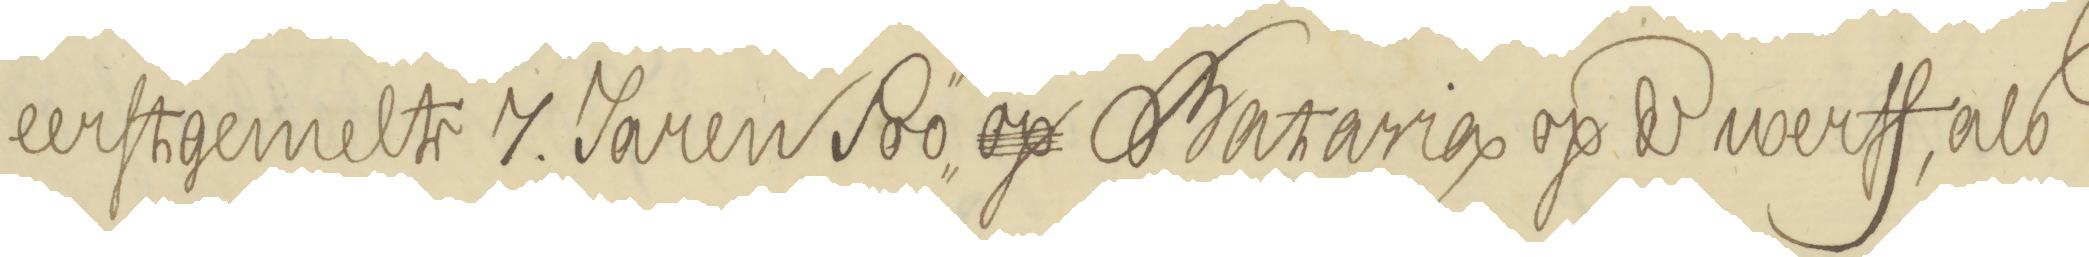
eerstgemelte 7. Iaren soo „ Batavia op de werff, als
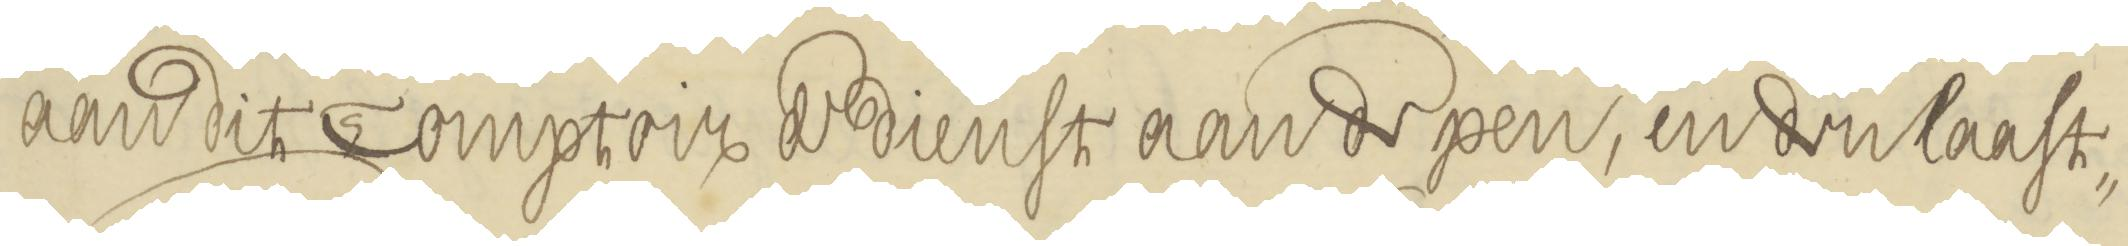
aan dit comptoir de dienst aan de pen, en den laast,
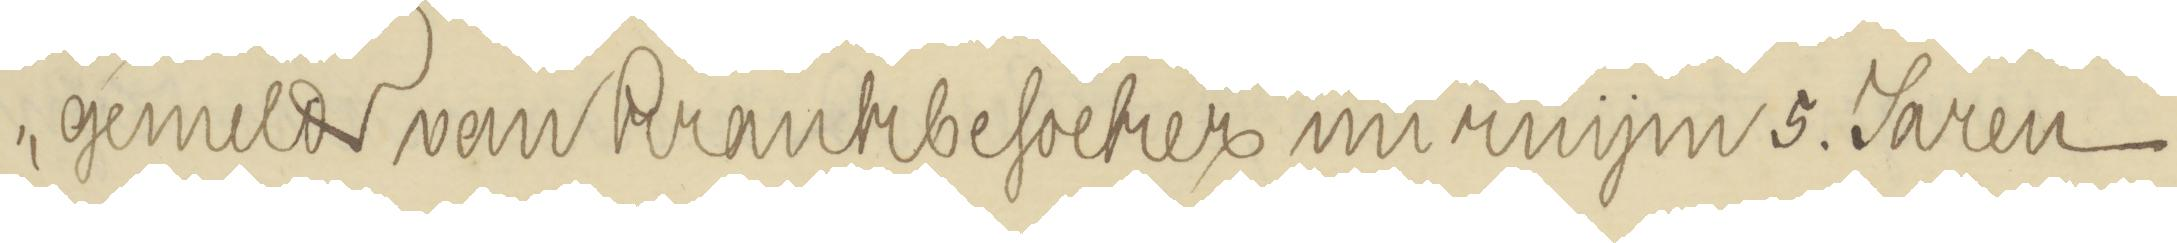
„gemelde van krankbesoeker nu ruijm 5. Iaren
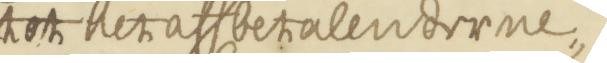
tot het affbetalen der ne„
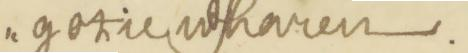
„gotiewharen.
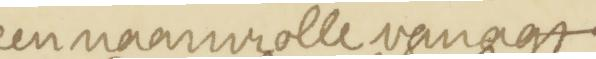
en naamrolle van agt
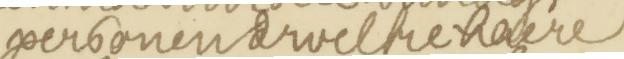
personen dewelke haere
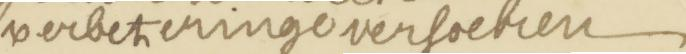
verbeteringe versoeken
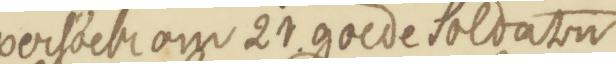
versoek om 21. goede soldaten
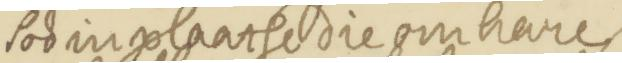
soo in plaatse die om hare
